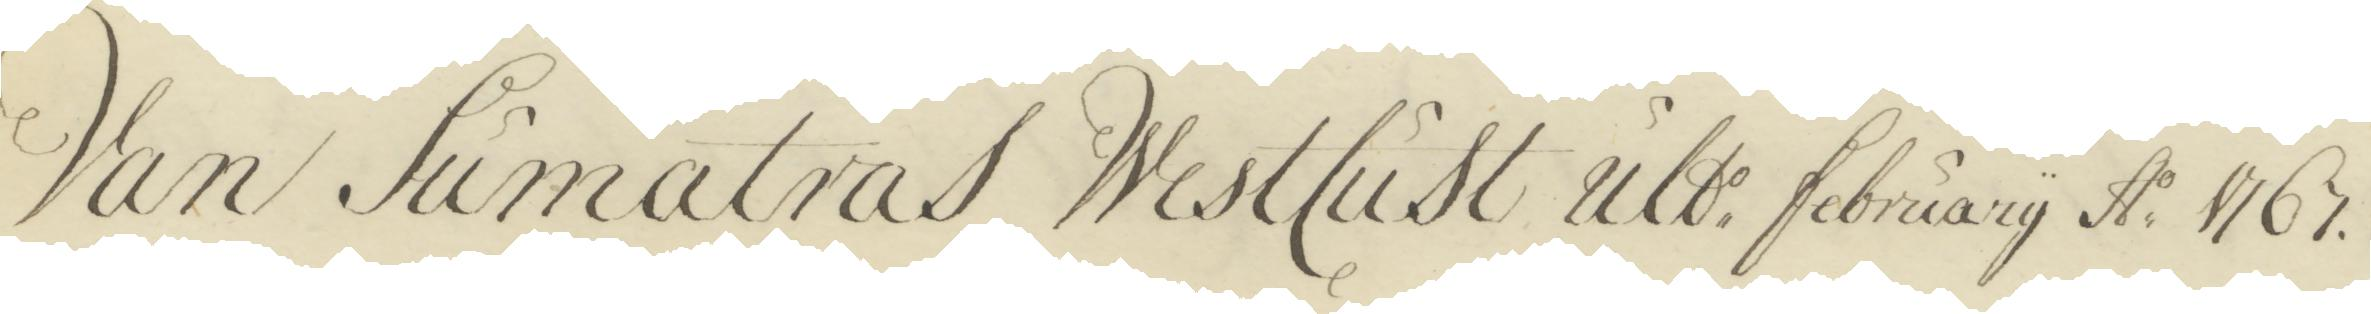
Van Sumatras West Cust ult„o februarij A„o 1767.
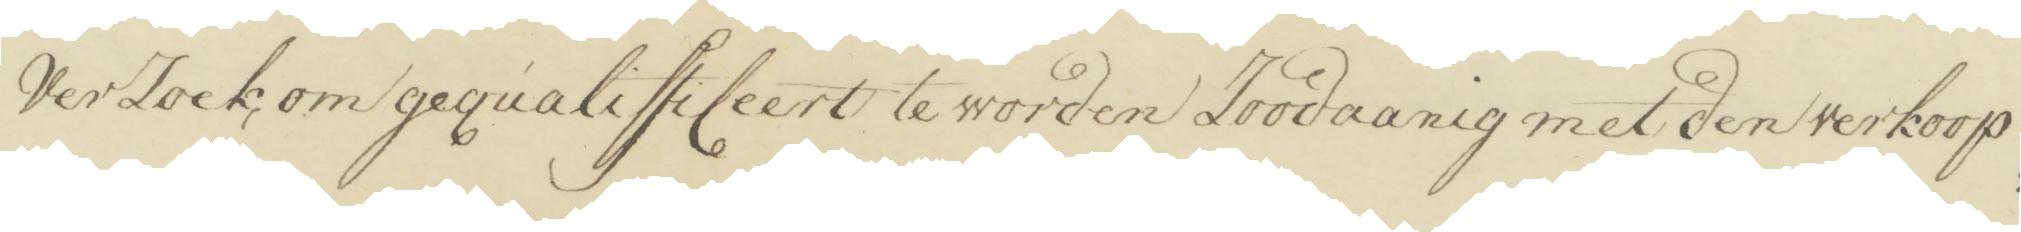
Verzoek om gequalifficeert te worden zoodaanig met den verkoop
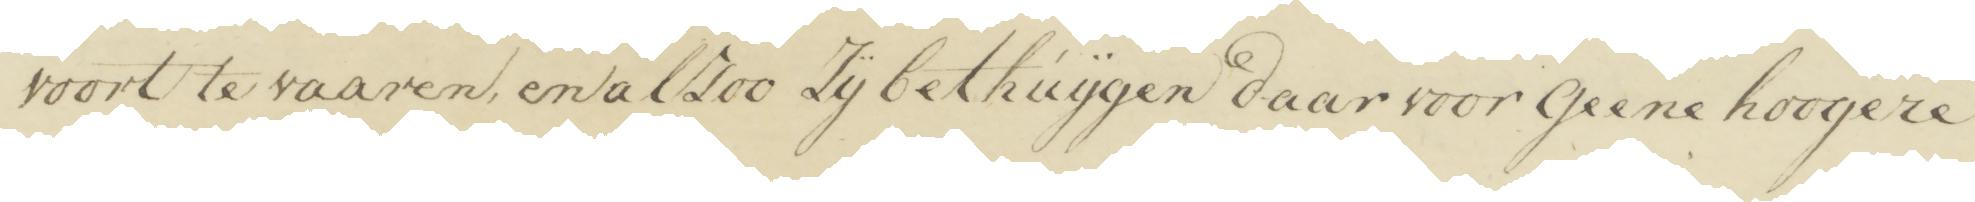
voort te vaaren, en alzoo zij bethuijgen daar voor geene hoogere
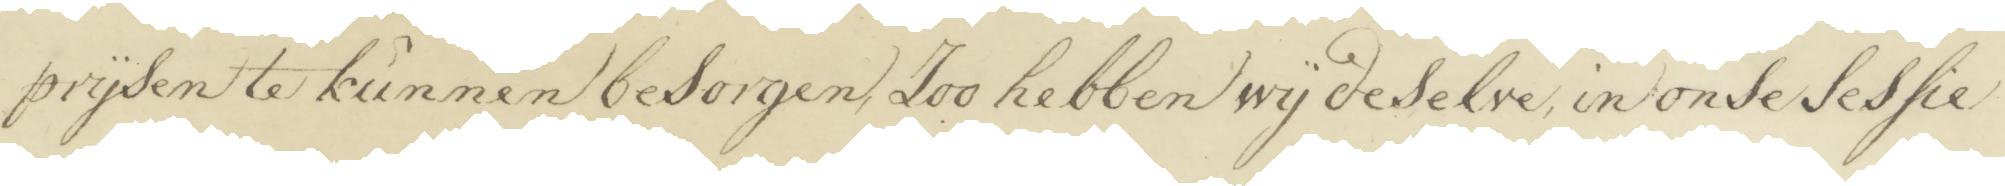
prijsen te kunnen besorgen, zoo hebben wij deselve, in onse sessie
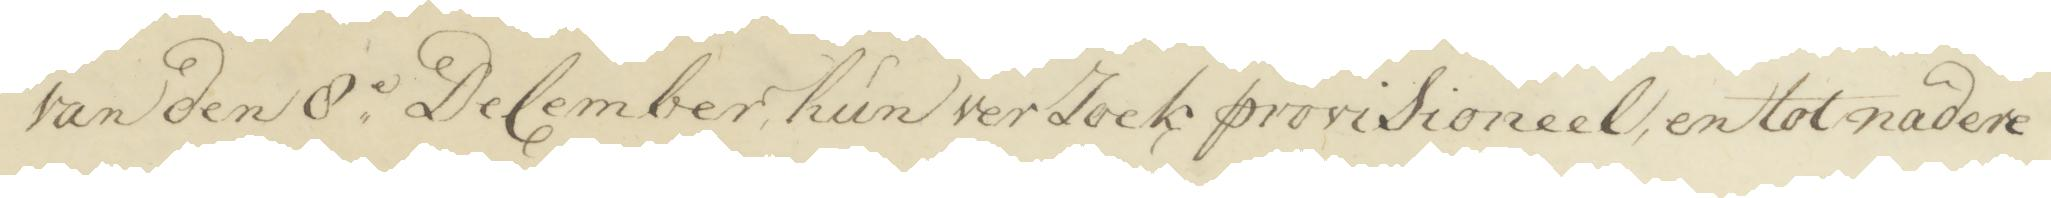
van den 8„e December, hun verzoek provisioneel, en tot nadere
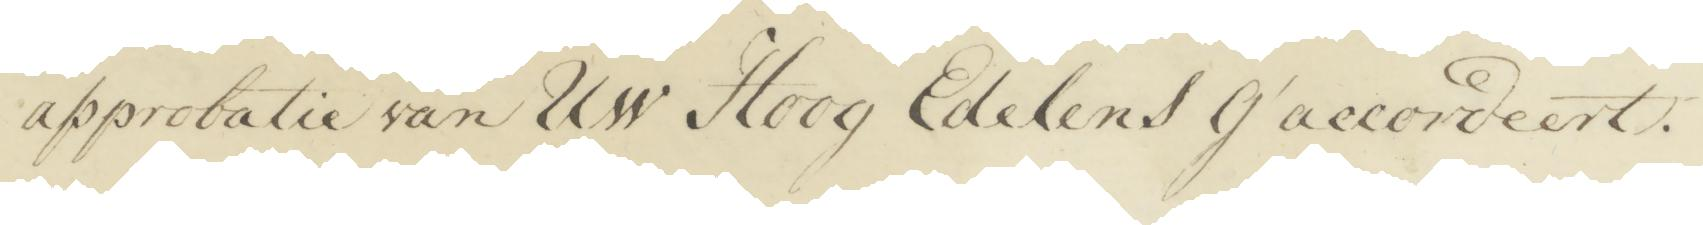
approbatie van Uw Hoog Edelens g’accordeert.
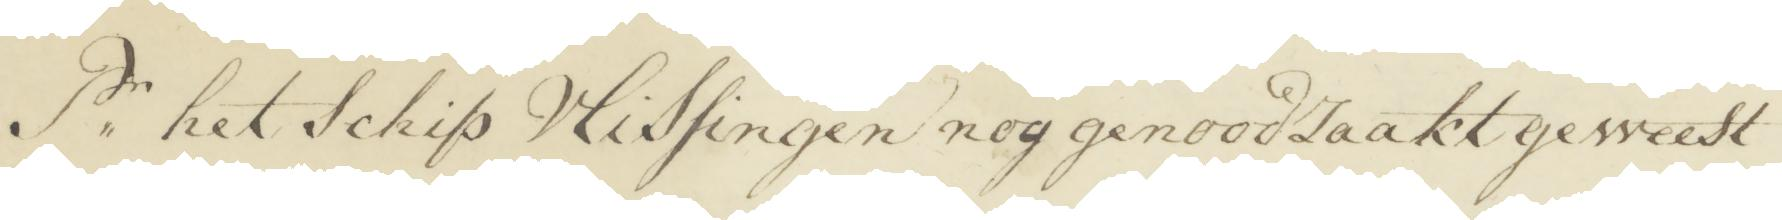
P„r het schip Vlissingen nog genoodzaakt geweest
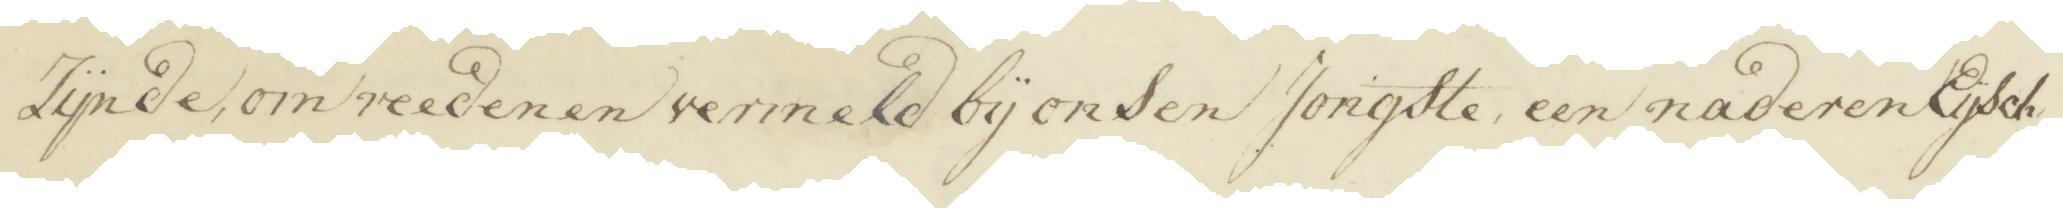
zijnde, om reedenen vermeld bij onsen Jongste, een naderen Eijsch
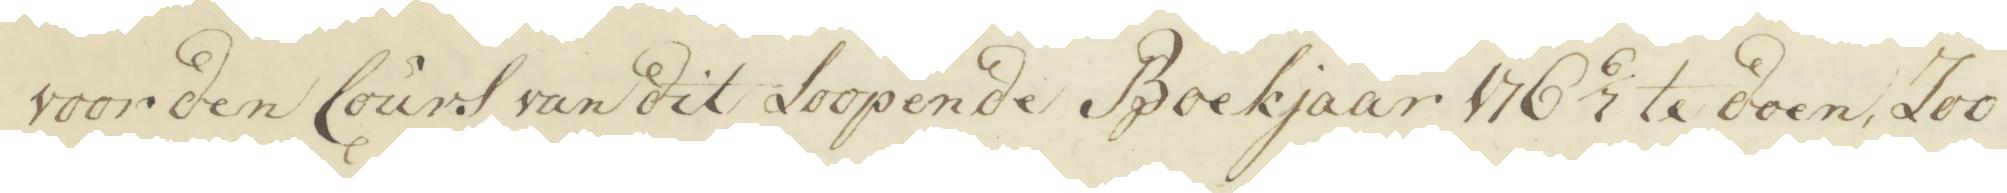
voor den Cours van dit Loopende Boekjaar 176 6/7 te doen, zoo
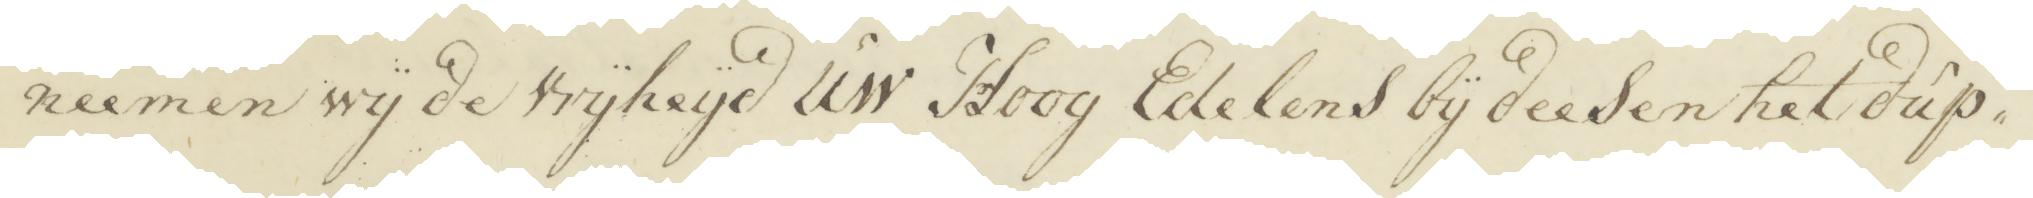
neemen wij de vrijheijd Uw Hoog Edelens bij deesen het dup„
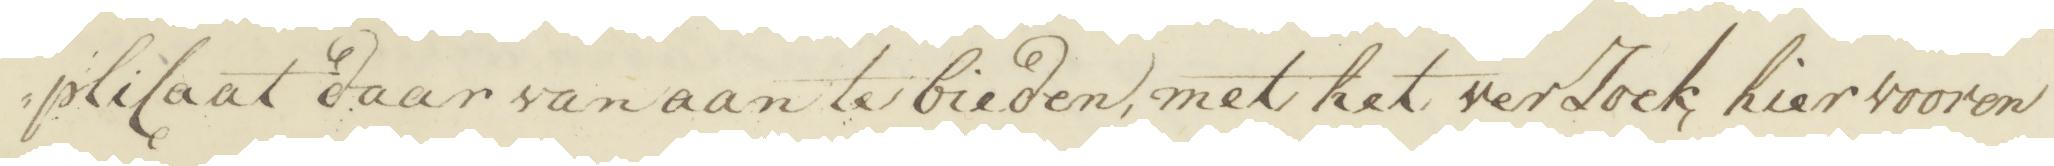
„plicaat daar van aan te bieden, met het verzoek, hier vooren
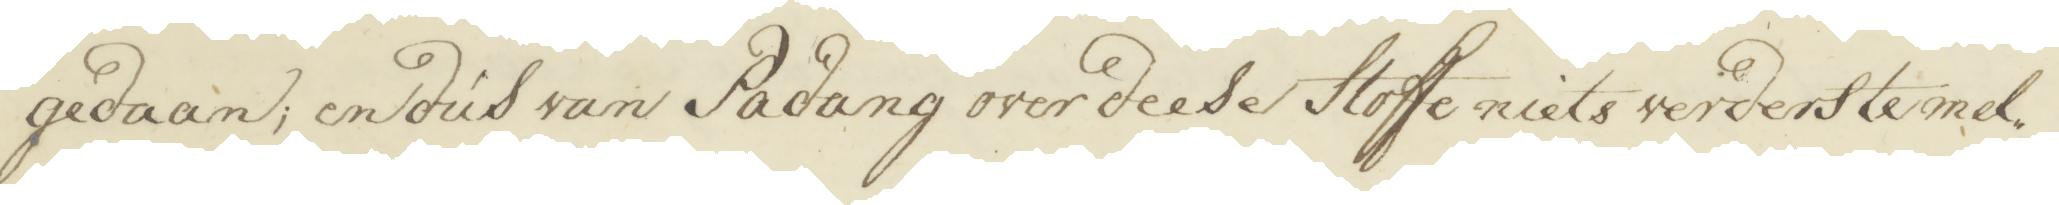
gedaan; en dus van Padang over deese stoffe niets verders te mel„
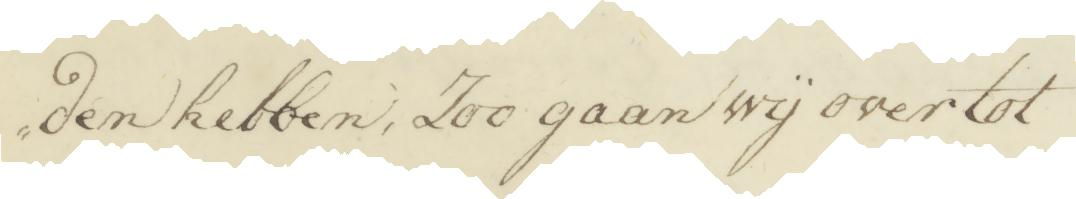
„den hebben, zoo gaan wij over tot
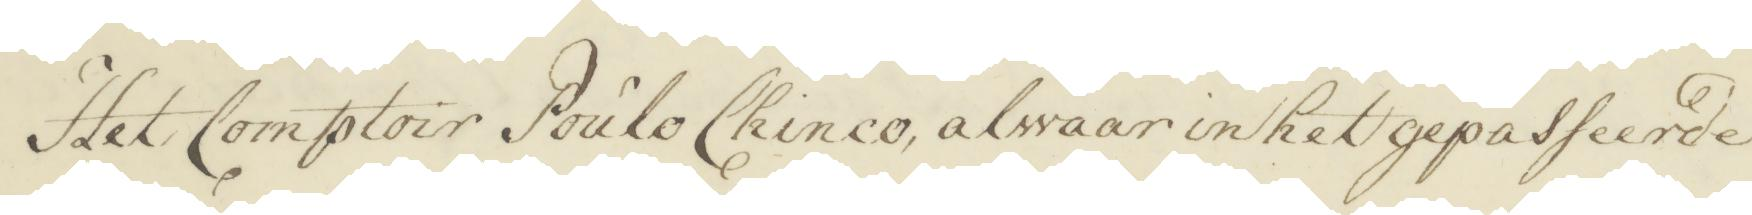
Het Comptoir Poulo Chinco, alwaar in het gepasseerde
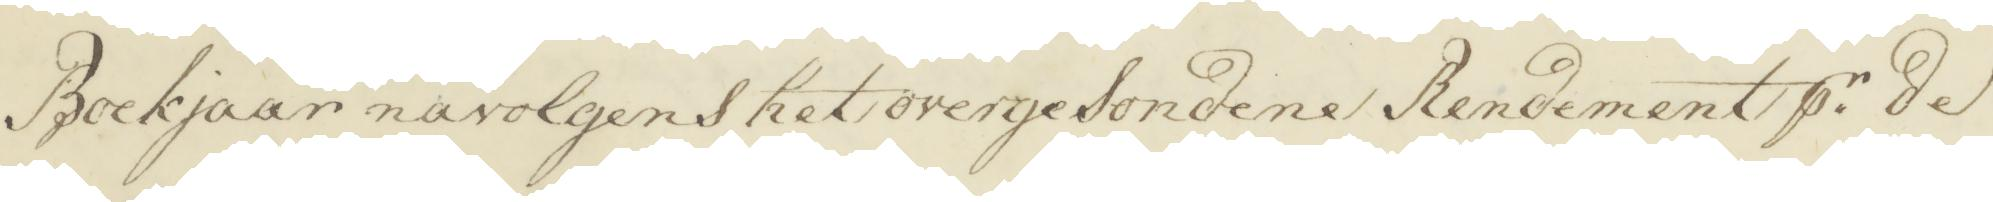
Boekjaar navolgens het overgesondene Rendement p„r de
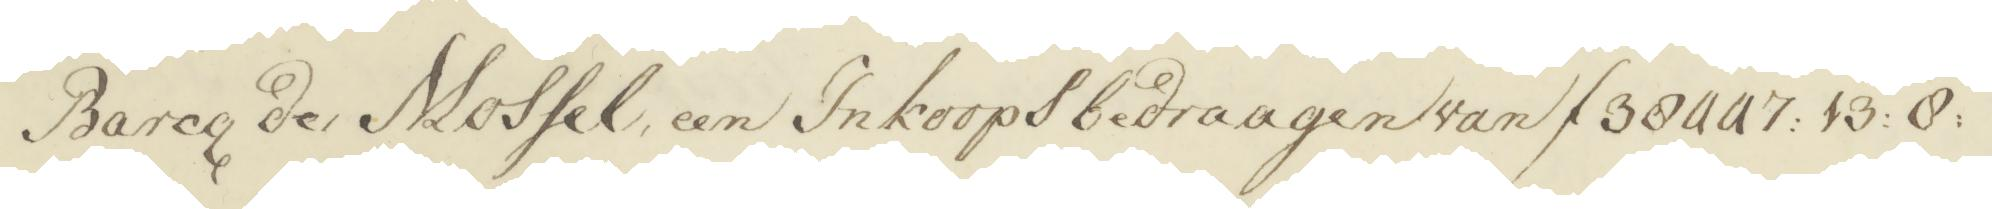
Barcq de Mossel, een Inkoops bedraagen van ƒ38447:13:8:
